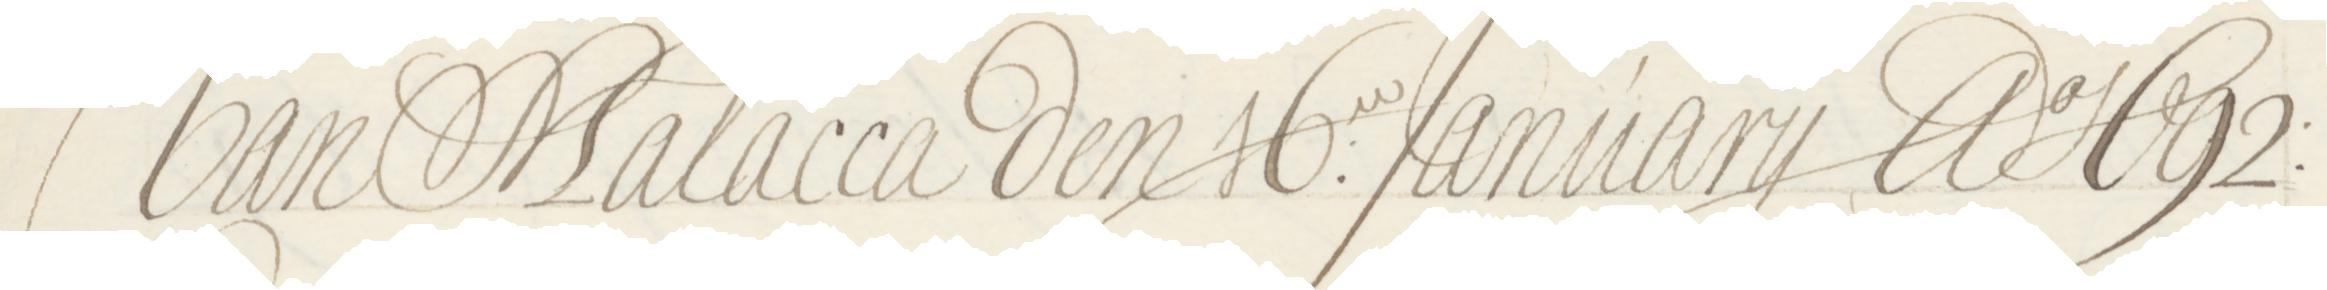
Van Malacca den 16:e January Ao 1692:
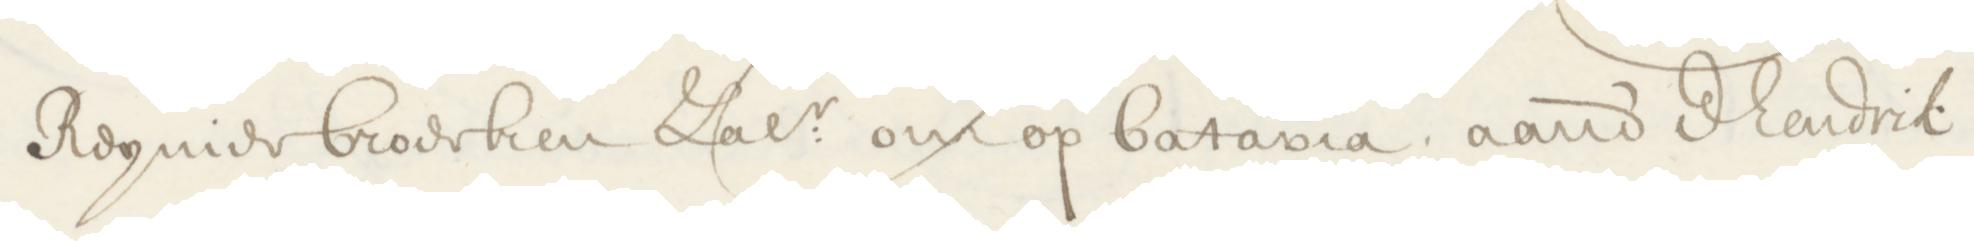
Reynier broerken zal:r om op batavia, aan d’ E hendrik
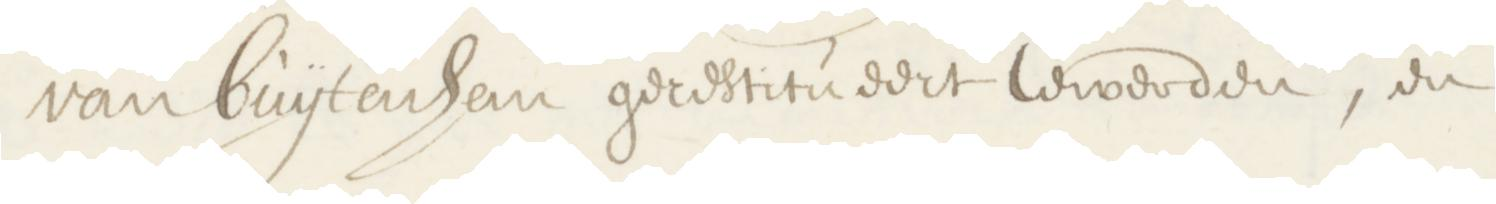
van buijtenhan gerestitueert tewerden, en
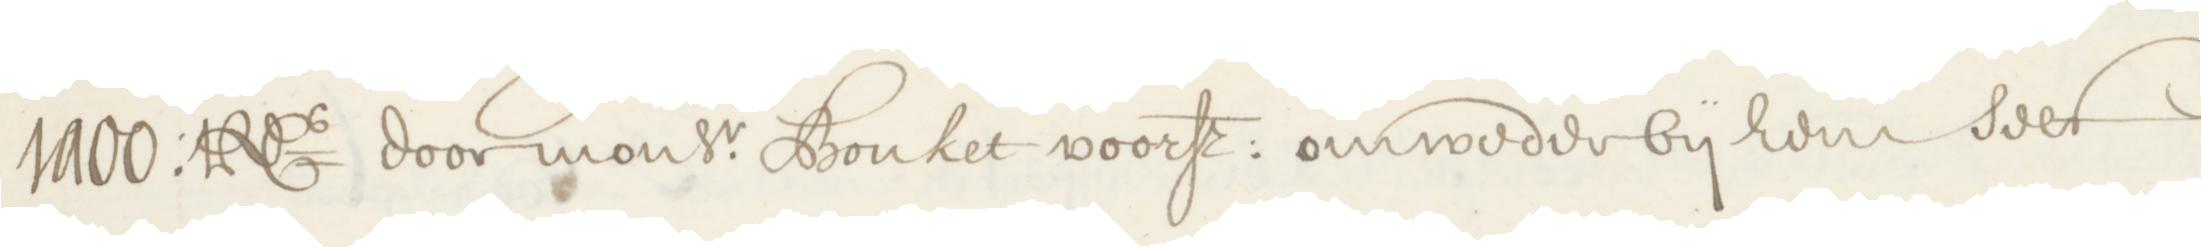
1400: rx=s door mons:r Bonket voorsz: om weder bij hem self
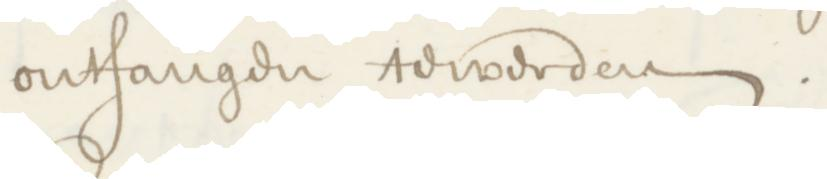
ontfangen te werden.
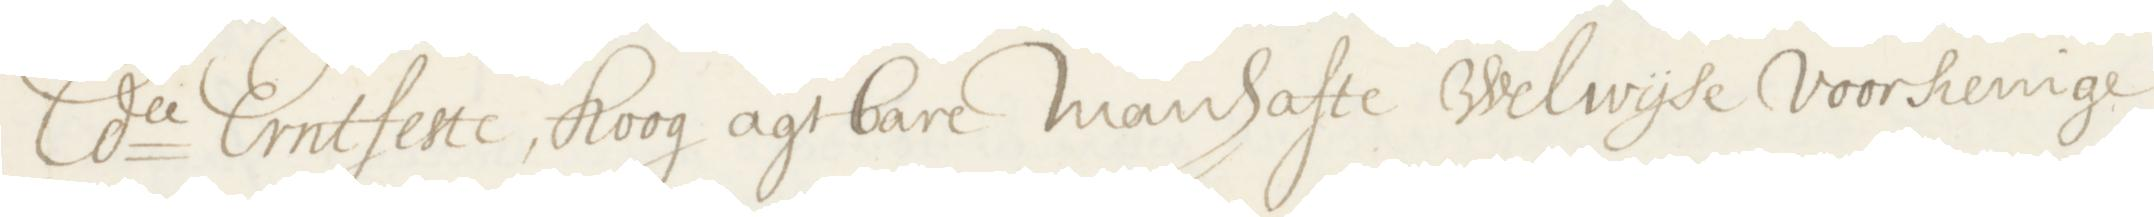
Ed=le Erntfeste, Hoog agtbare manhafte Welwijse voorsienige
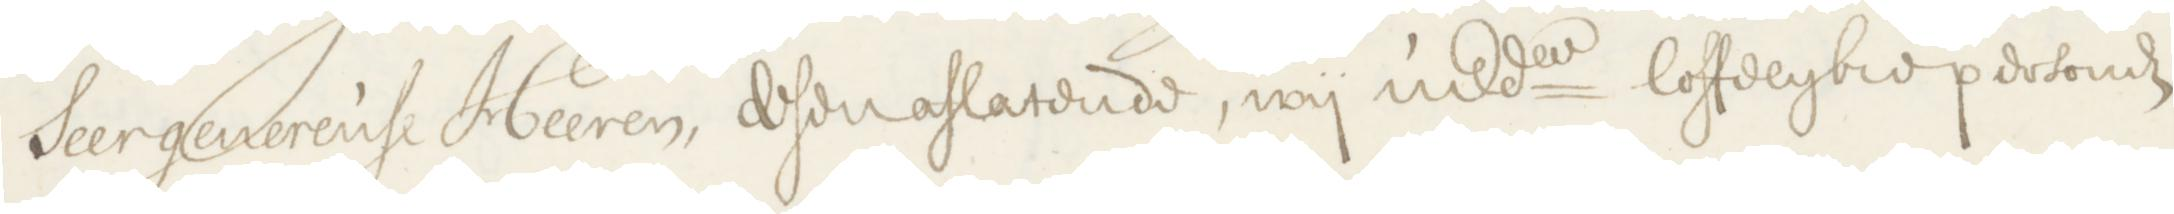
seer genereuse Heeren, desen aflatende, wij uEd=le loffelyke personen
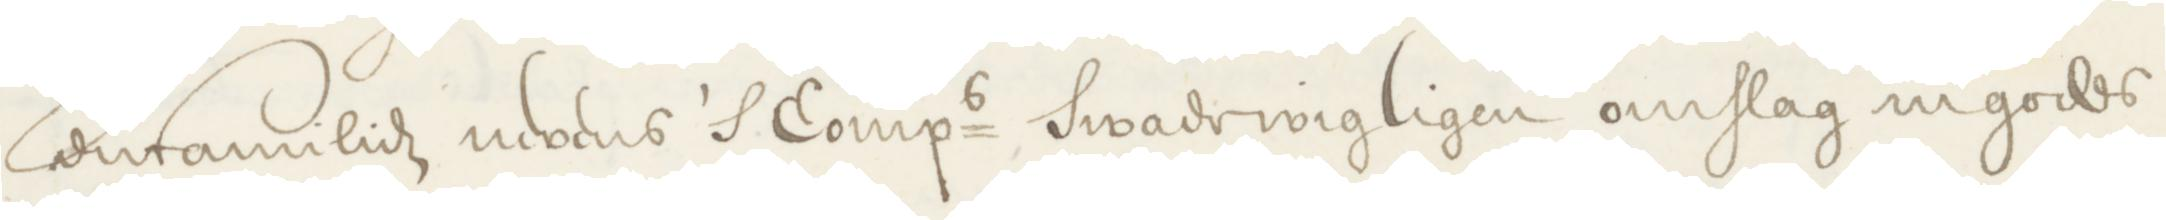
en familien nevens ’s Comp=s swaerwigtigen omslag in godes
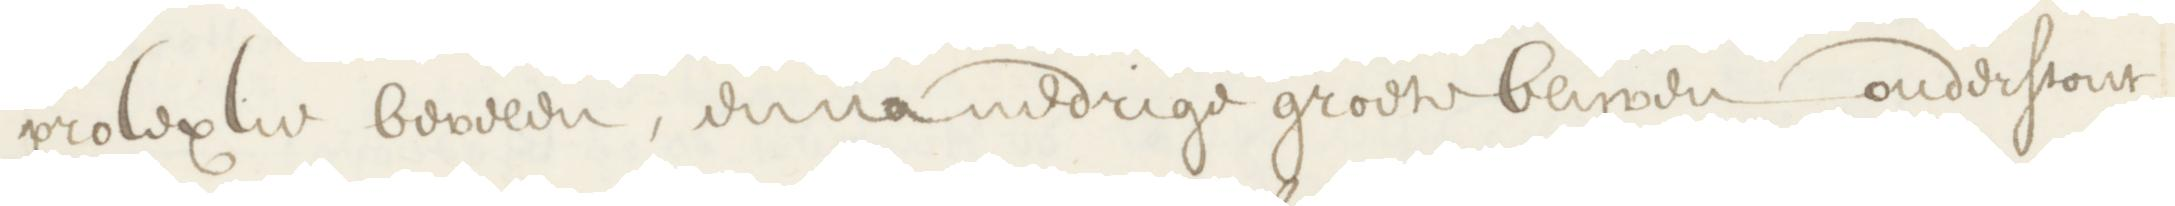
protextie bevelen, en na nedrige groete blijven onderstont
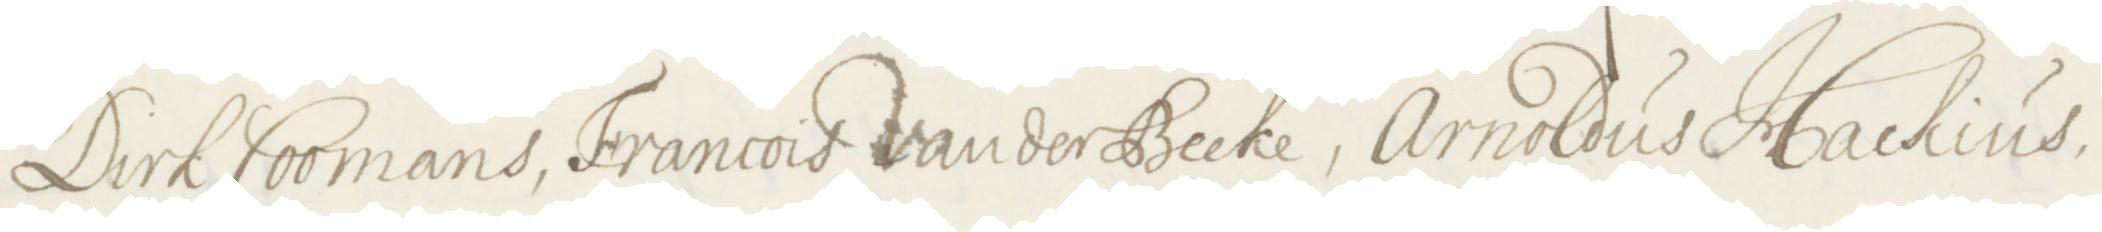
Dirk Coomans, Francois van der Beeke, Arnoldus Hackius,
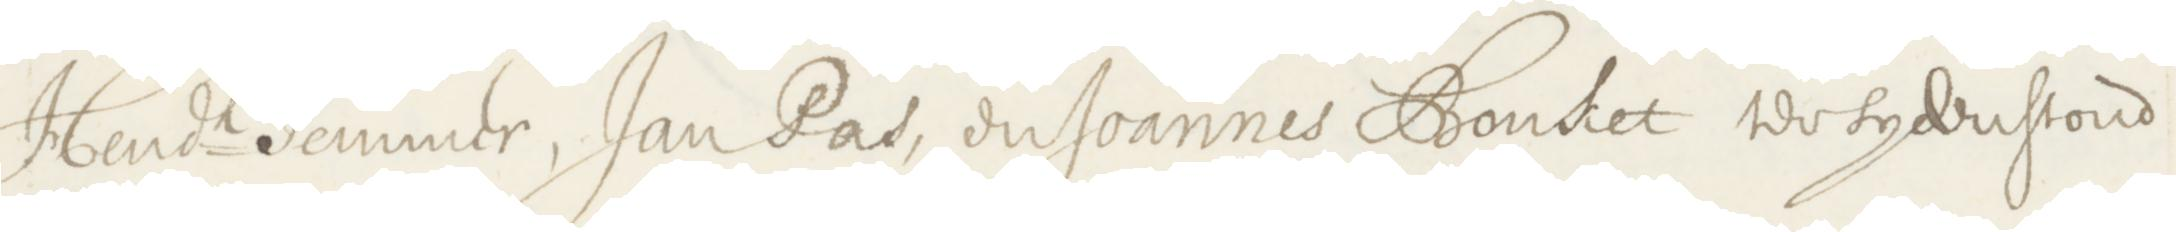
Hend=k Temmer, Jan Pas, en Joannes Bonket ter syden stond
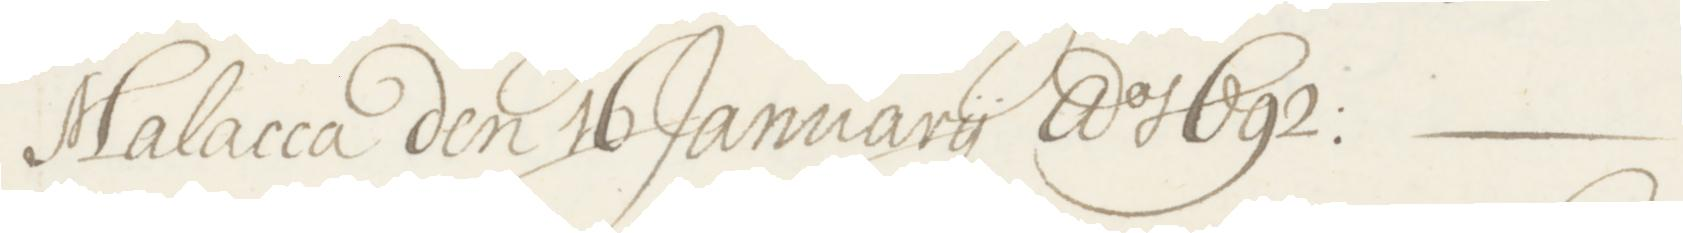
Malacca den 16 Januarij Ao 1692: —
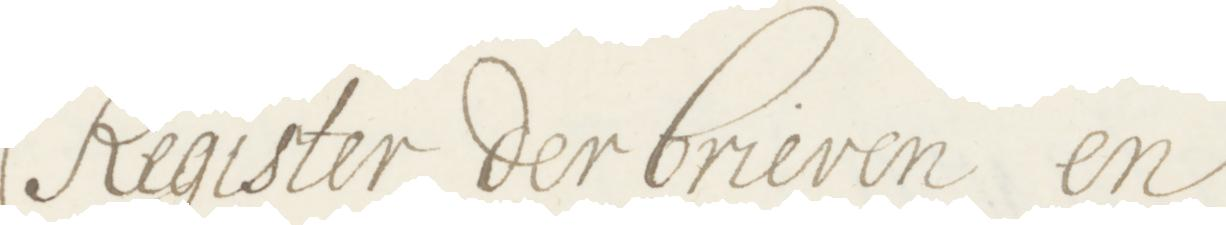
Register der brieven en
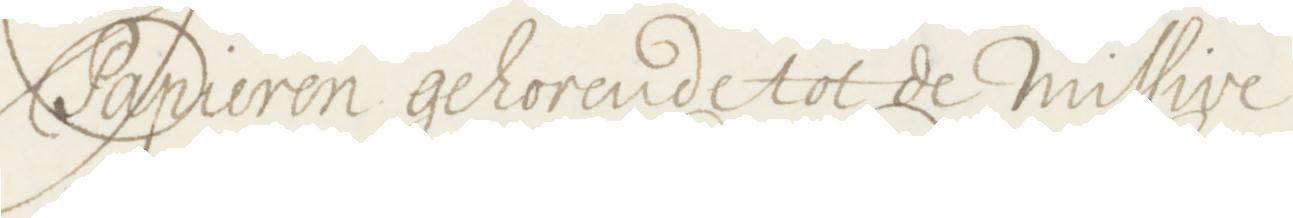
Papieren gehorende tot de missive
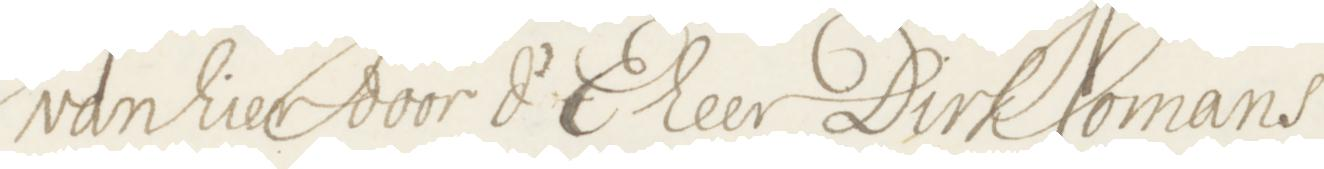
van hier door d’ E heer Dirk Comans
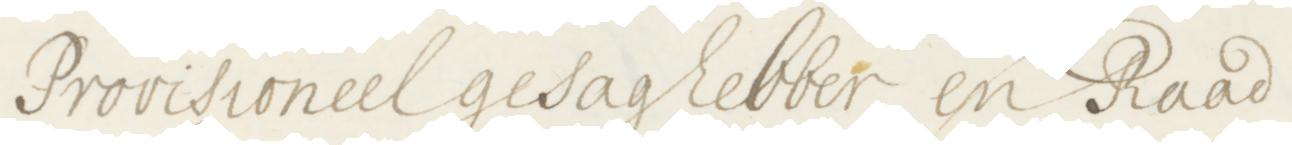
Provisioneel gesaghebber en Raad
